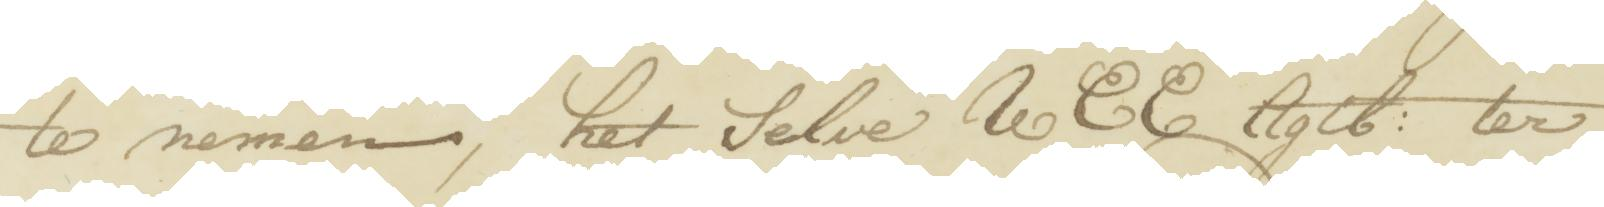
te nemen, het selve U E E Agtb: ter
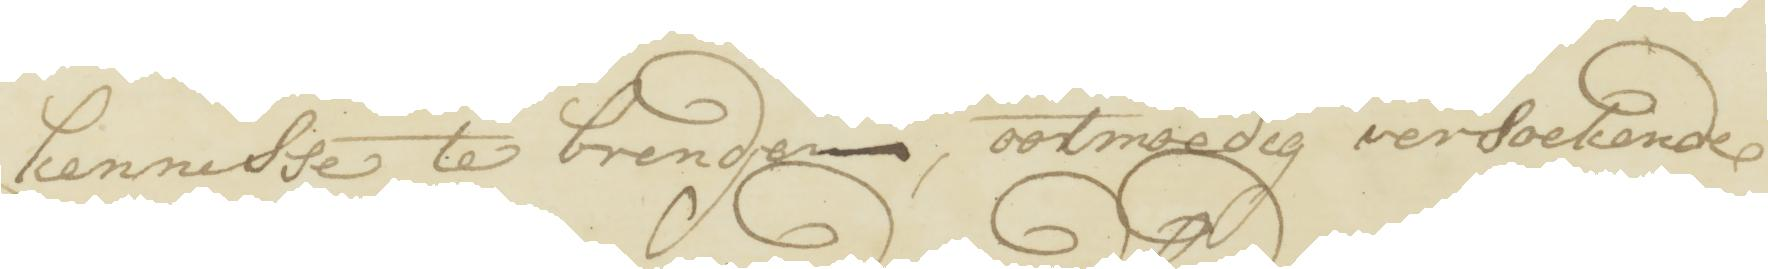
kennisse te brengen, ootmoedig versoekende
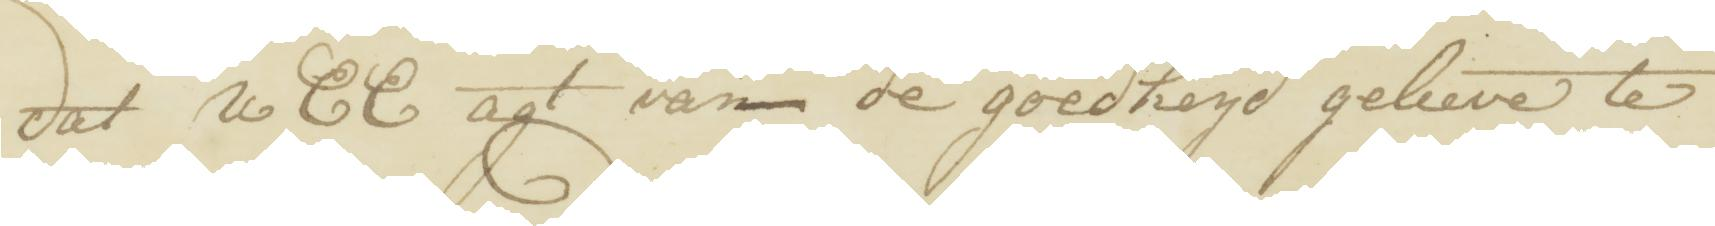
dat U E E agt van de goedheyd gelieve te
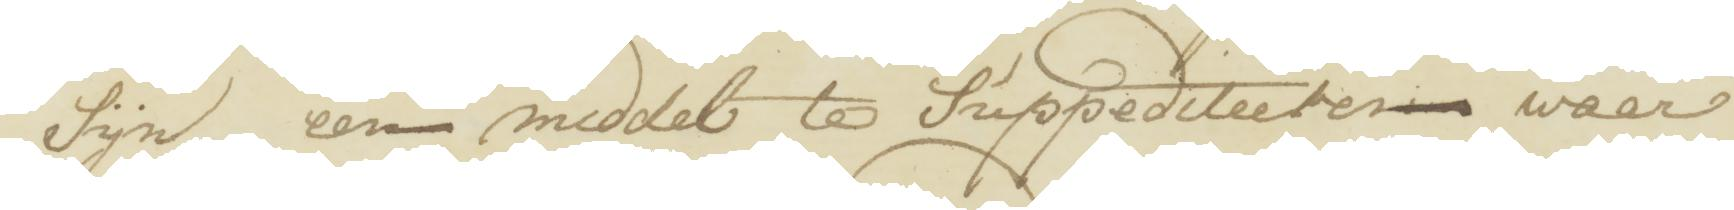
sijn, een middel te suppediteeren waar
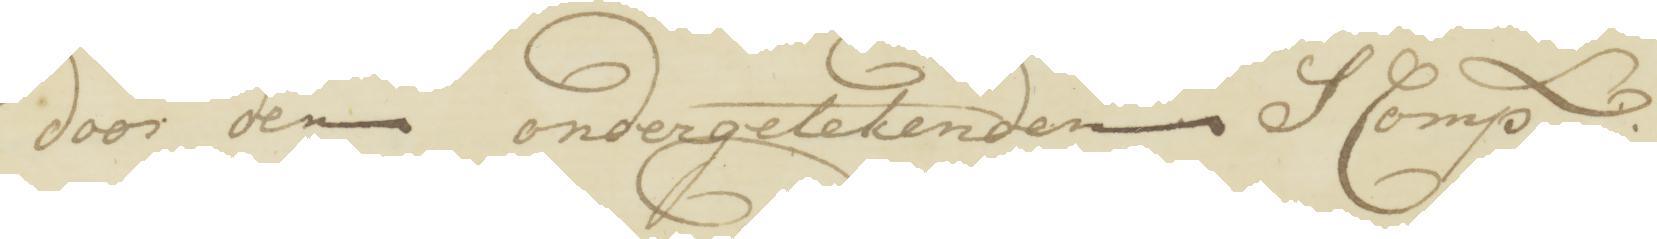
door den ondergetekenden s Comp:
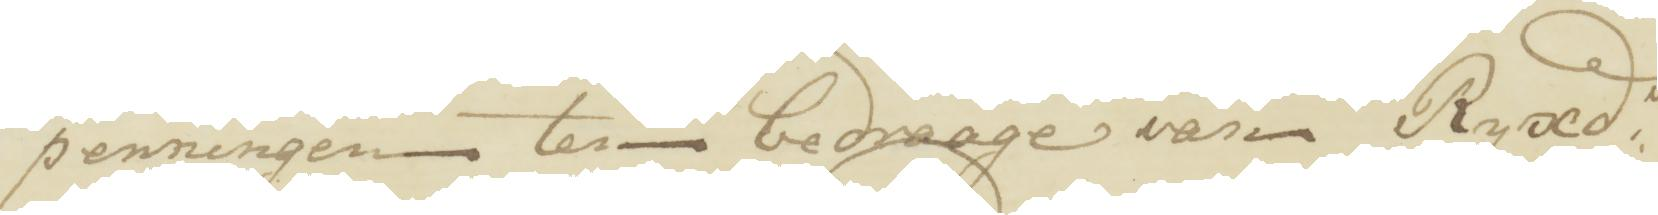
penningen ten bedraage van Ryxd:s
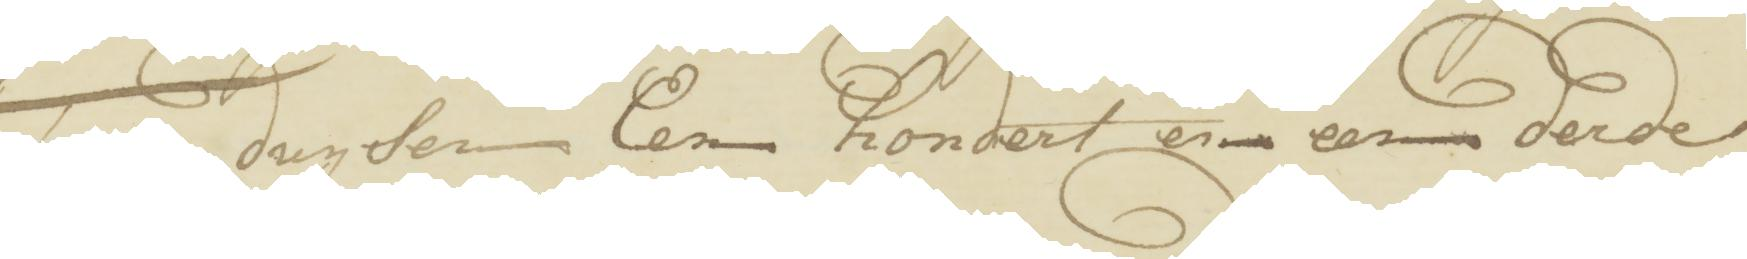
Twee duysen Een hondert en een derde
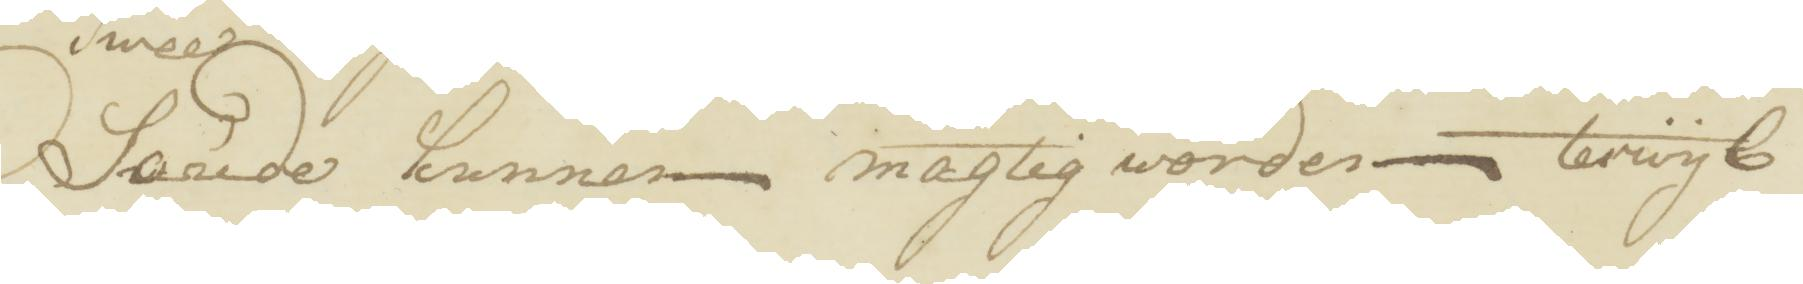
soude kunnen magtig worden terwijl
